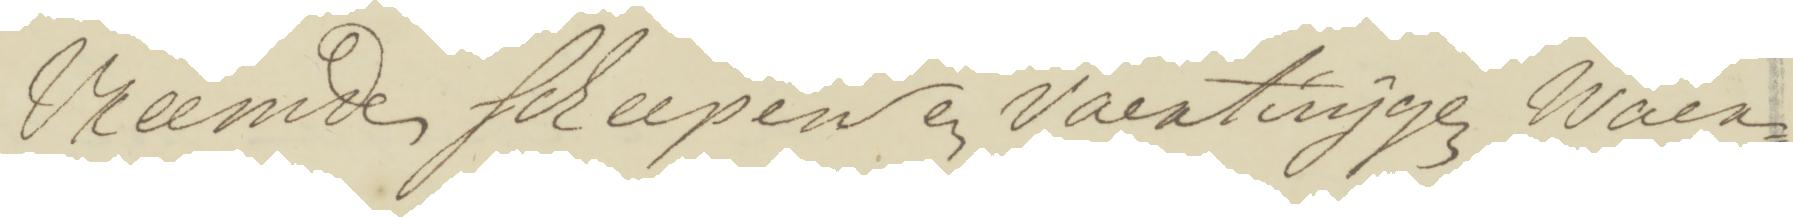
Vreemde scheepen en vaertuijgen waer=
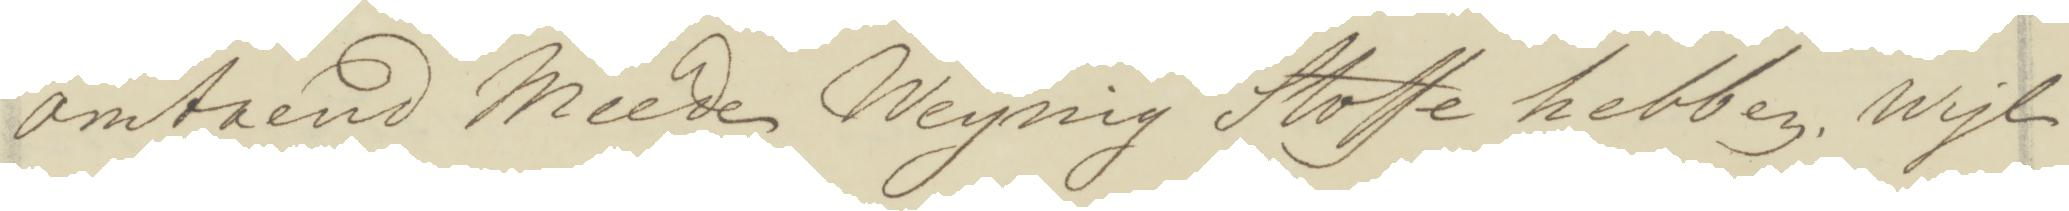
omtrend meede weijnig stoffe hebben, wijl
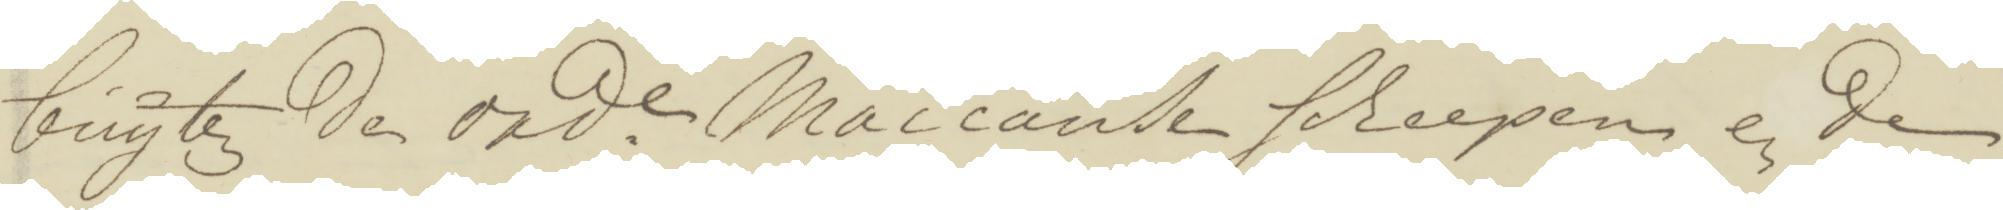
buijte de ord.e Maccause scheepen en de
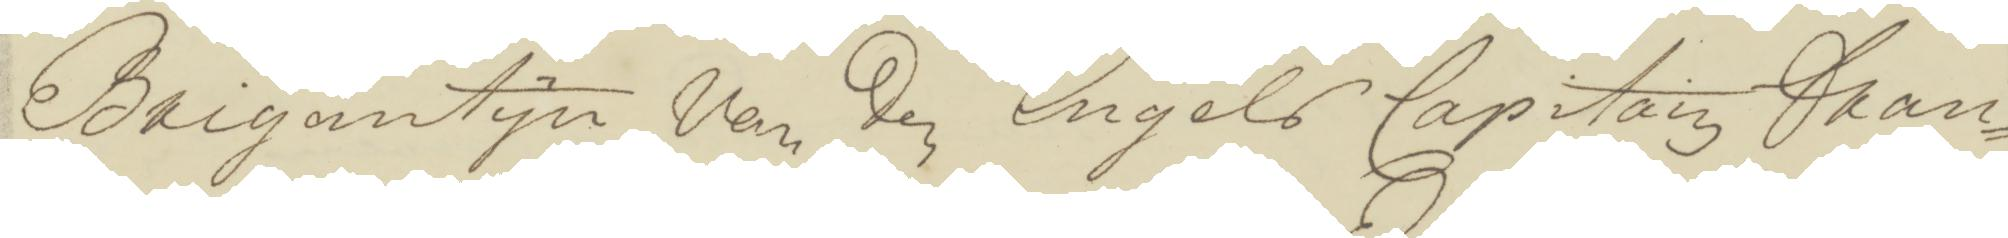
Brigantijn van den Engels Capitain Fran=
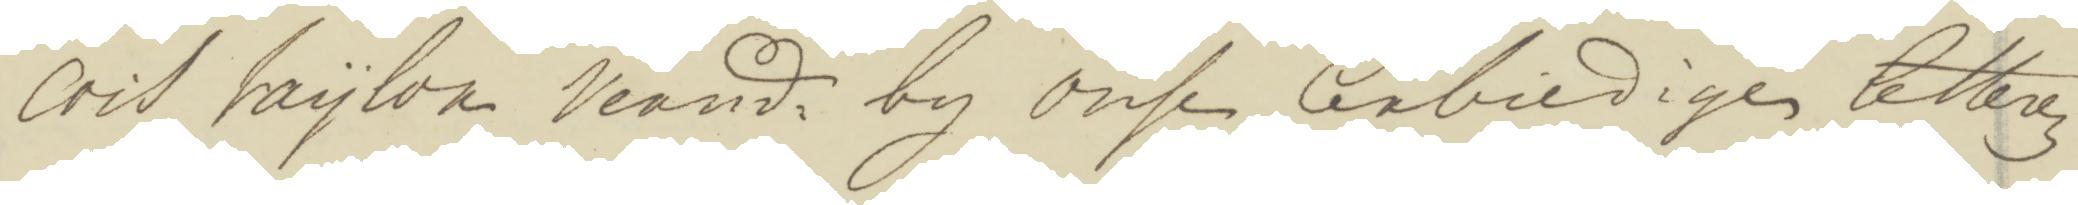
cois taijlor vernd: by onse Eerbiedige letteren
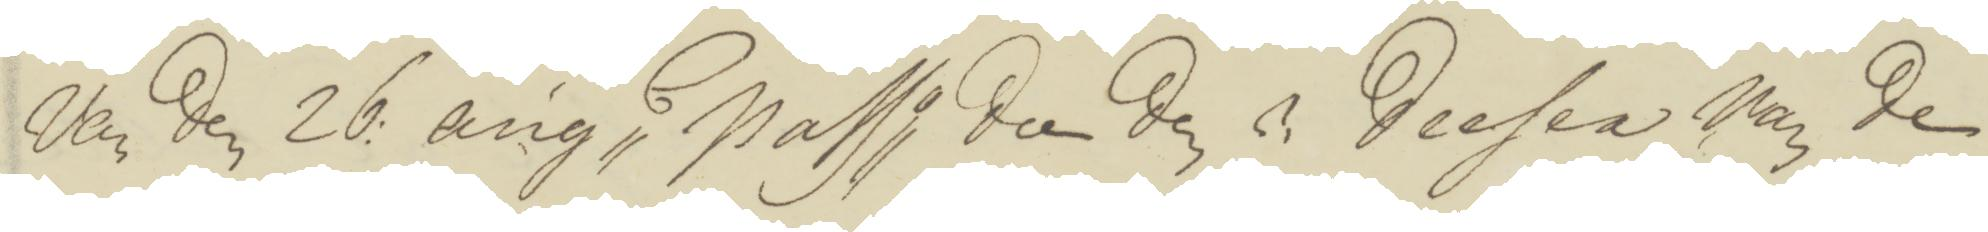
van den 26: aug„s pass„o die den 3 deeser van de
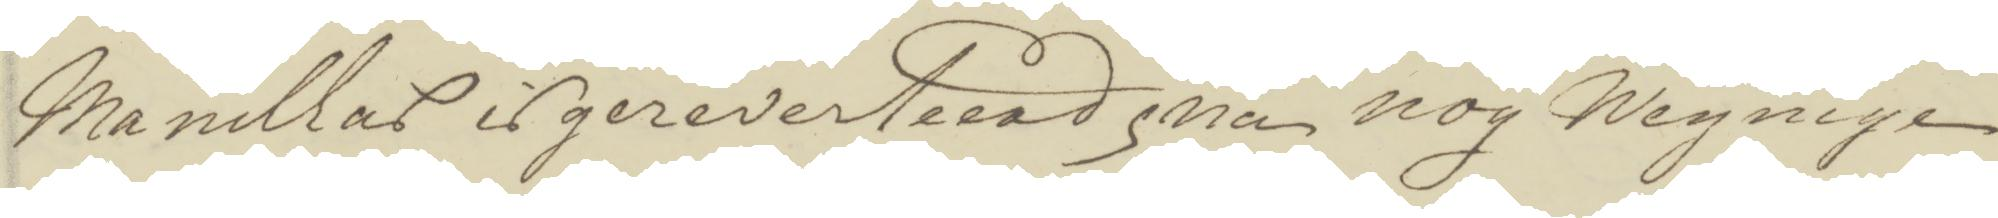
Manillas is gereverteerd, na nog weijnige
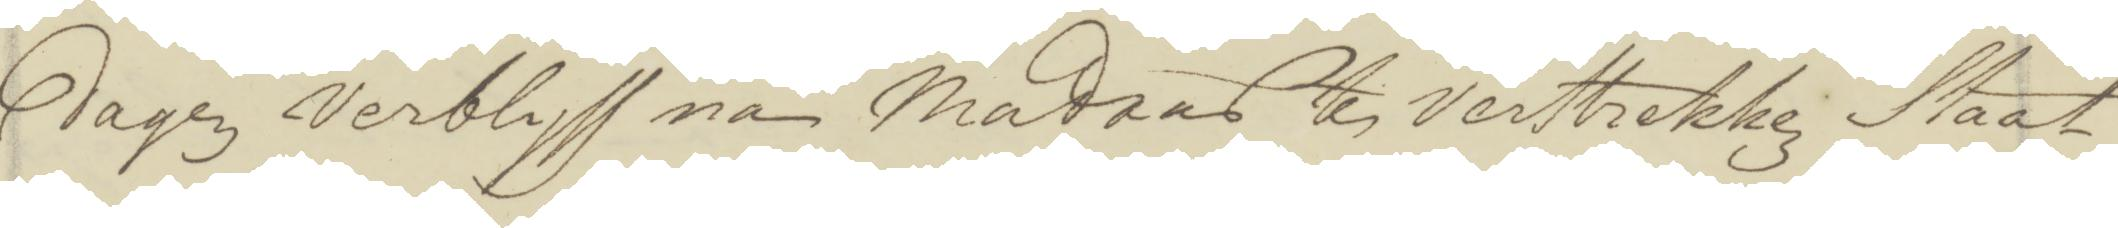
dagen verblyff na Madras te verstrekken staat
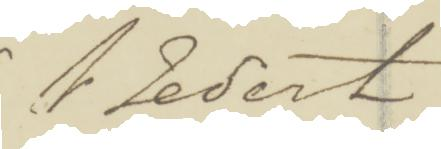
't zedert
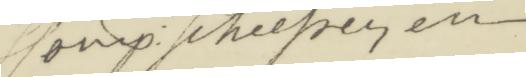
Comp:s Scheepen en
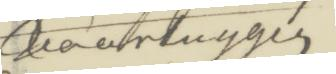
vaartuygen
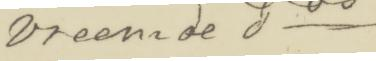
vreemde d=os
